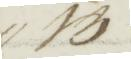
„ 13
